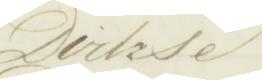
Dirkse
